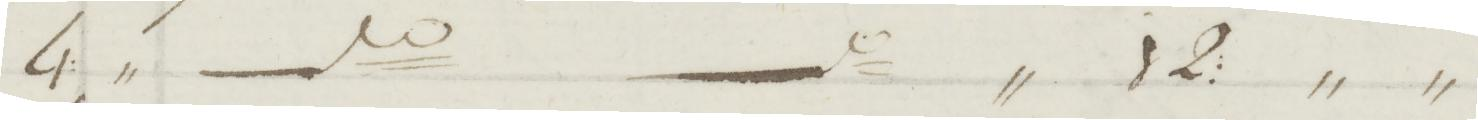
4: „ _=o _=o „ 12: „ „
